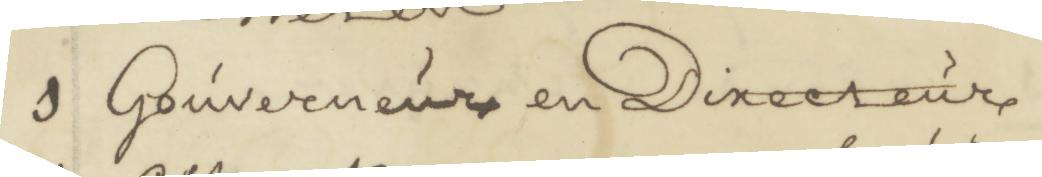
1 Gouverneur en Directeur
